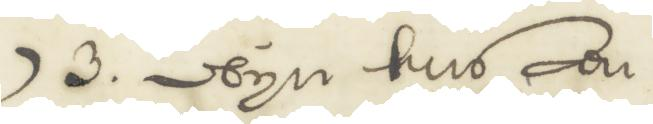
73. wijn kisten
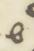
b
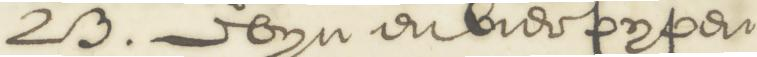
23. wijn en bier pijpen
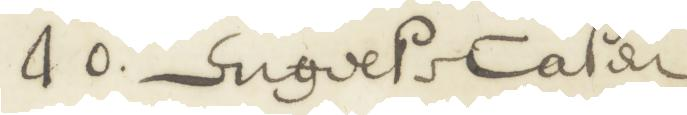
40. Engelse Casen
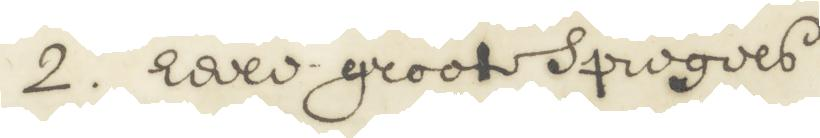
2. heele groote spiegels
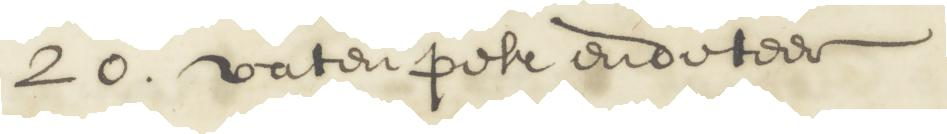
20. vaten pek ende teer
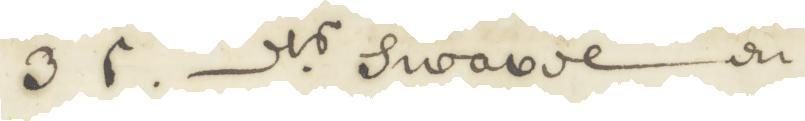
3 5. d.ts swavel en
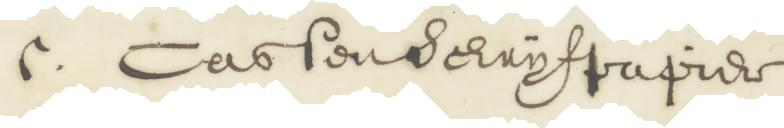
5. Casten schrijfpapier
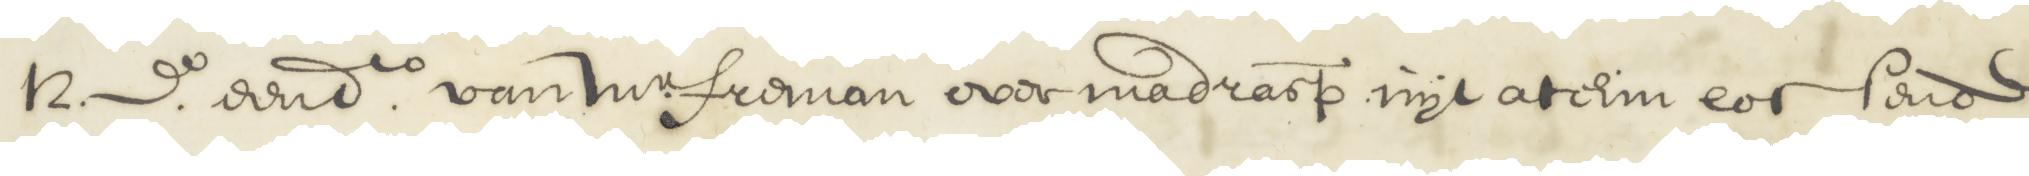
12. d.o een d.to van m.r freman over madrasp. uijt atchin lossende
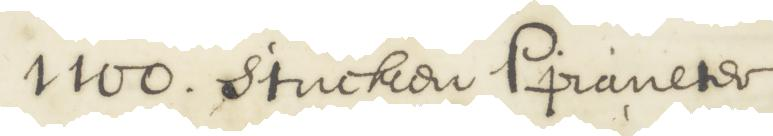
1100. s'tucken spiaulter
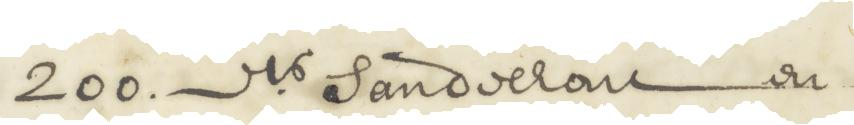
200. d.ts sandelhout en
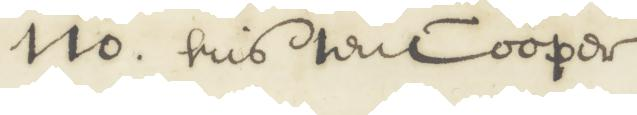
110. kisten Cooper
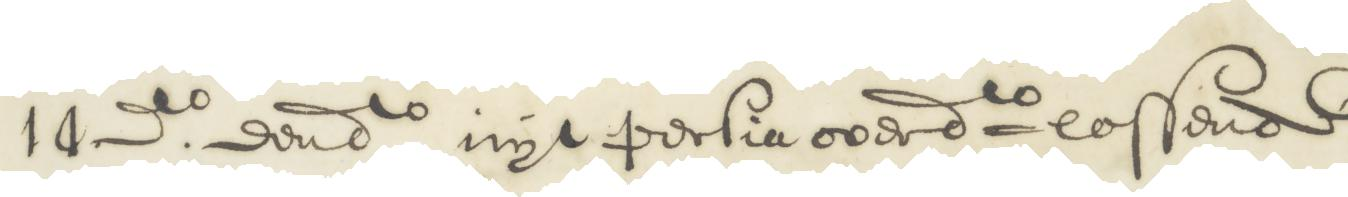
14. d.to een d.to uijt persia over d=to lossende
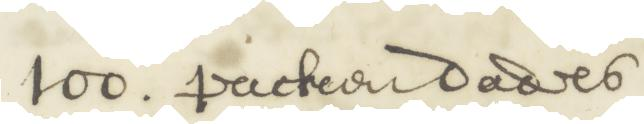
100. packen dadels
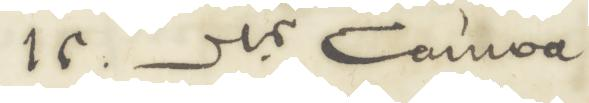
15. d.ts Cauwa
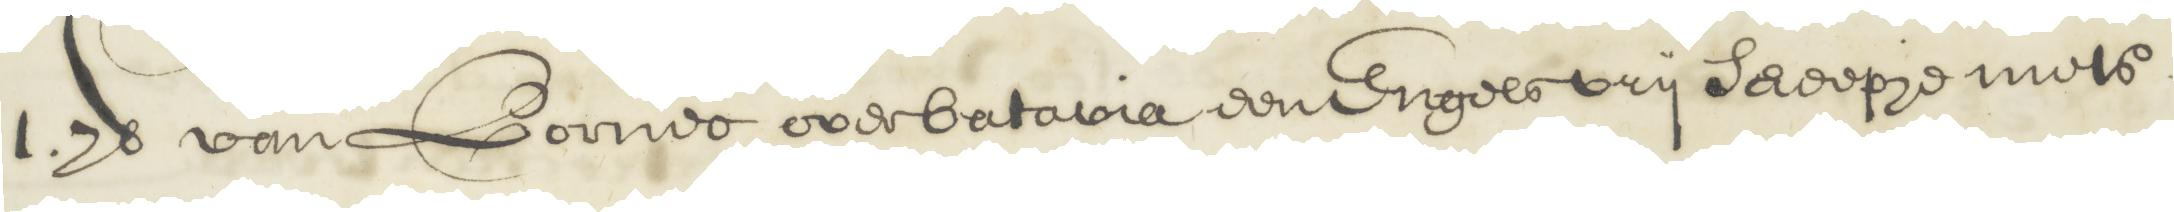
1.7b van Borneo over batavia een Engels vrij scheepje niets
